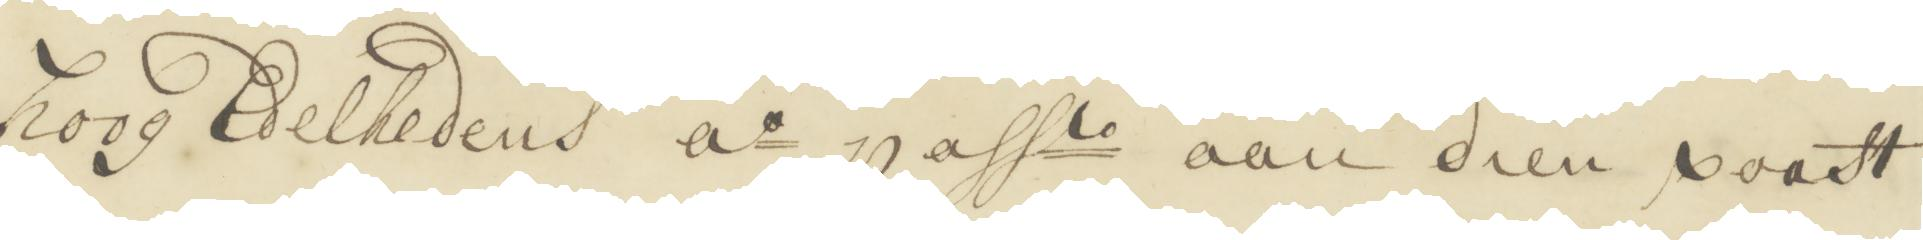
hoog Edelhedens a=o pass=to aan dien vorst
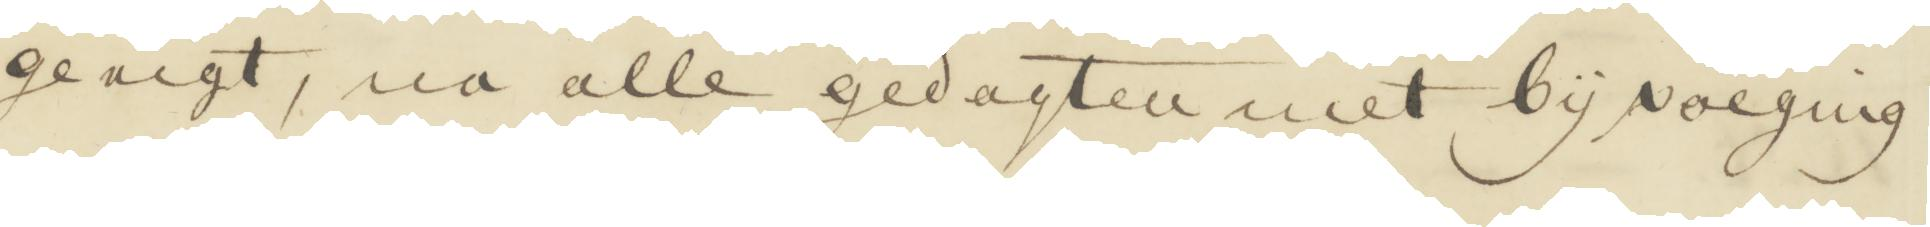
gerigt, na alle gedagten met bij voeging
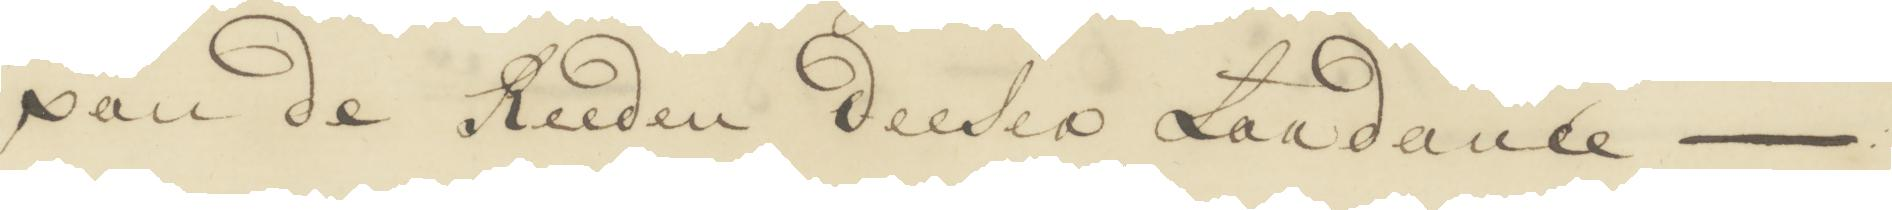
van de Reeden deeser tardance —
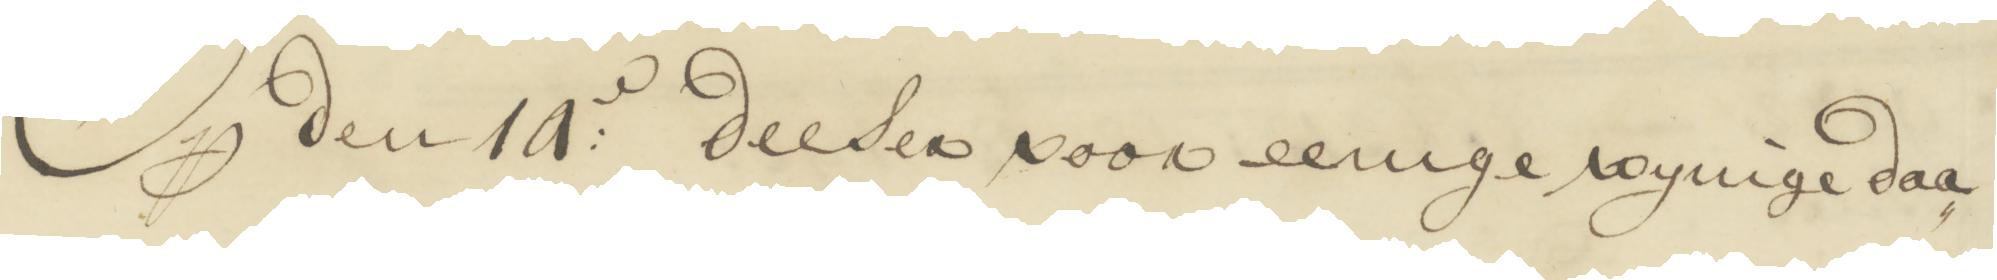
Op den 14:e deeser voor eenige wijnige daa„
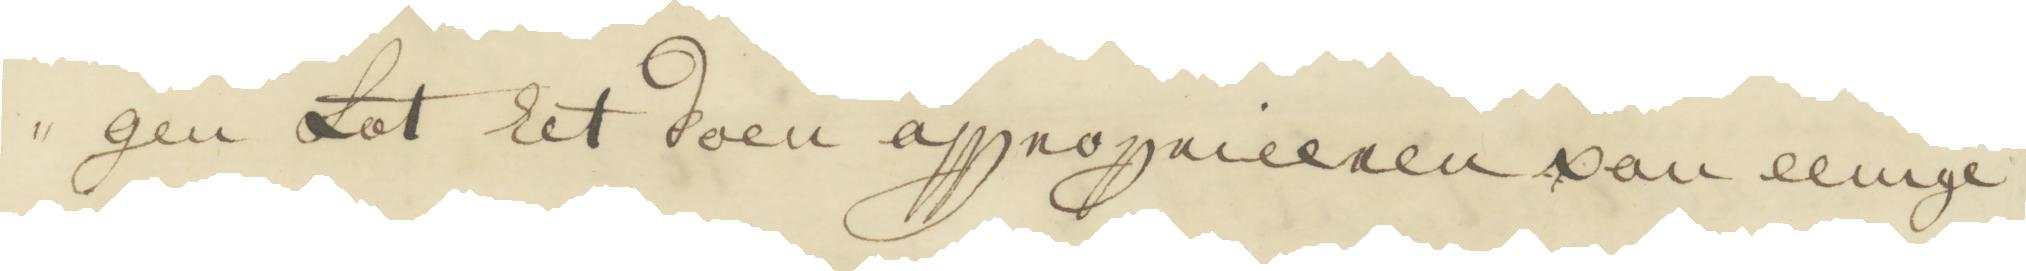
„gen tot het doen approprieeren van eenige
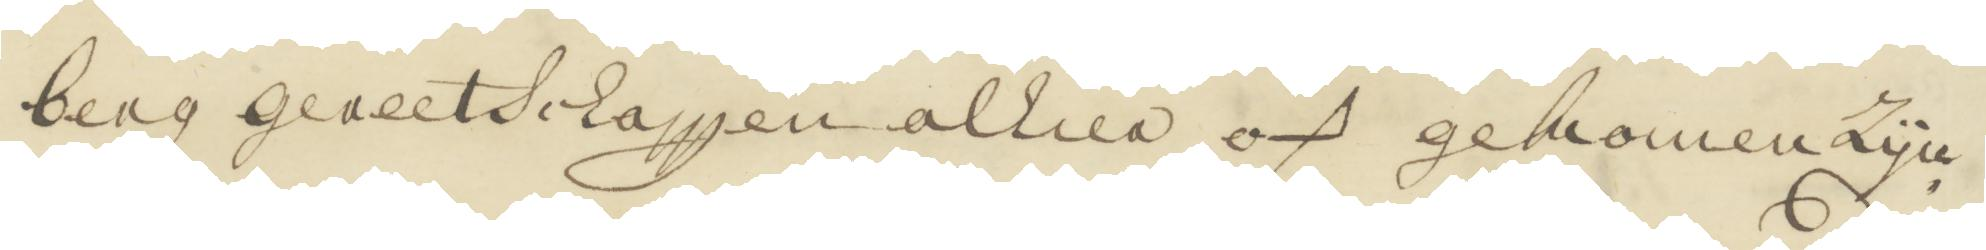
berg gereetschappen alhier over gekomen zijn„
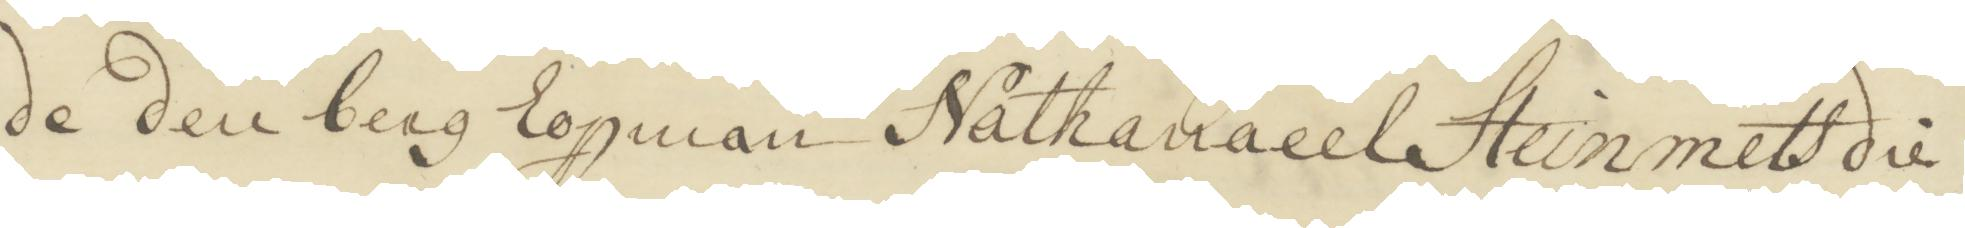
de den berg hopman Nathanaeel Steinmets die
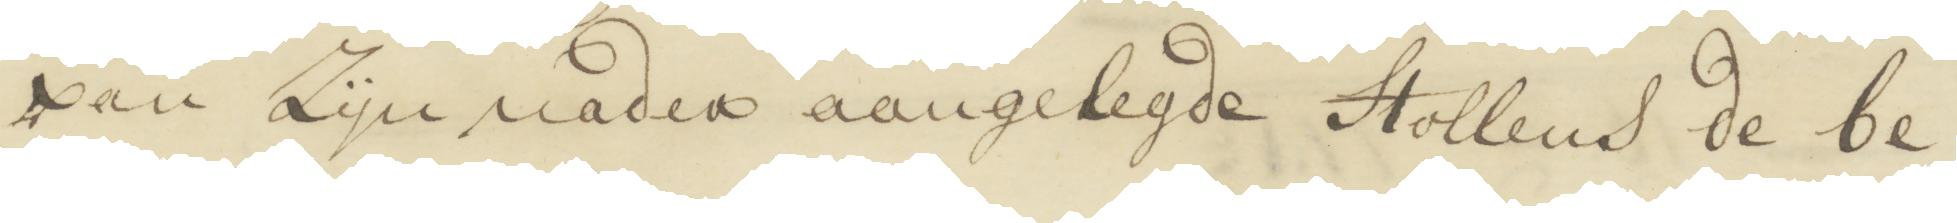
van zijn nader aangelegde stollens de be
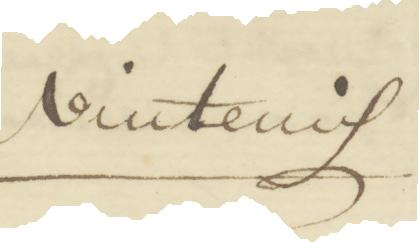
vintenis
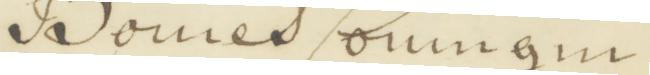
Bomes Coningin
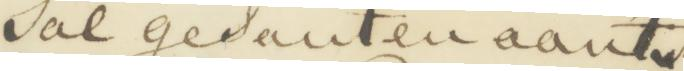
sal gesanten aan’t
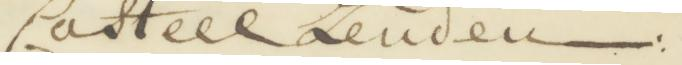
Casteel zenden:
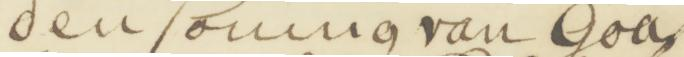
den Coning van Goa
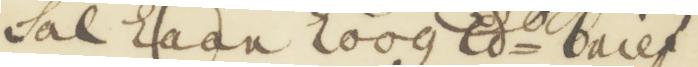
sal haar hoog Ed=s brief
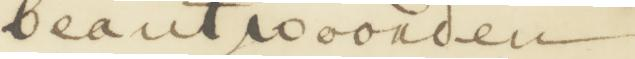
beantwoorden
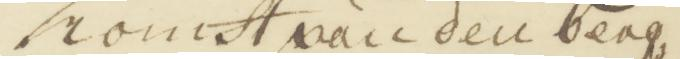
komst van den berg„
